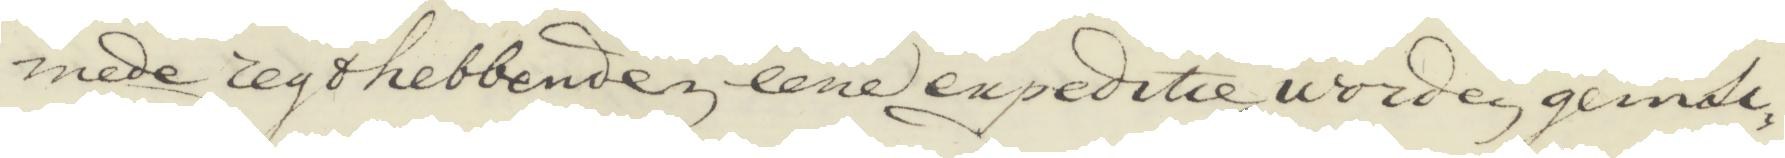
mede regthebbenden eene expeditie worden geinsi„
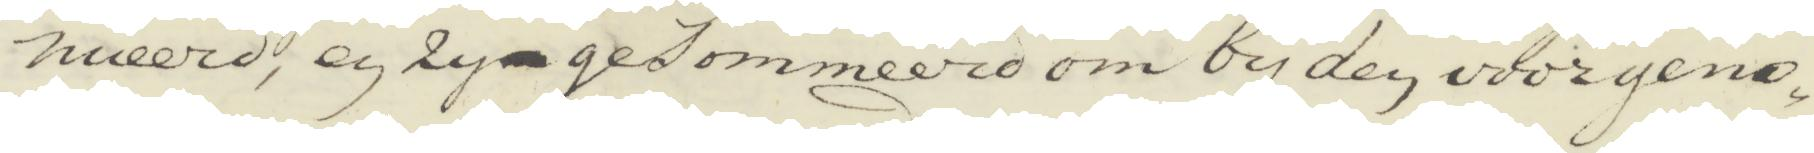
nueerd, en zyn gesommeerd om by den voorgeno„
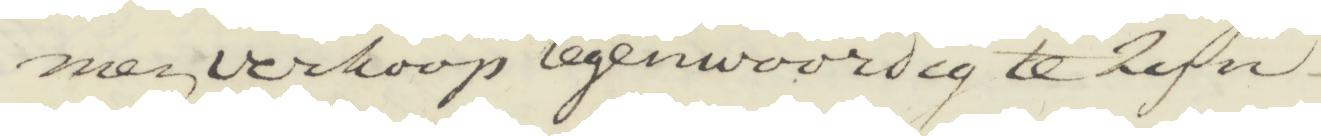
men verkoop tegenwoordig te zyn
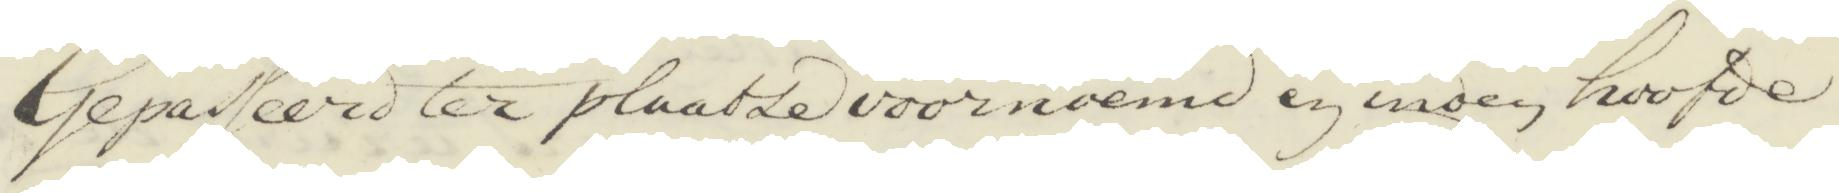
Gepasseerd ter plaatse voornoemd en inden hoofde
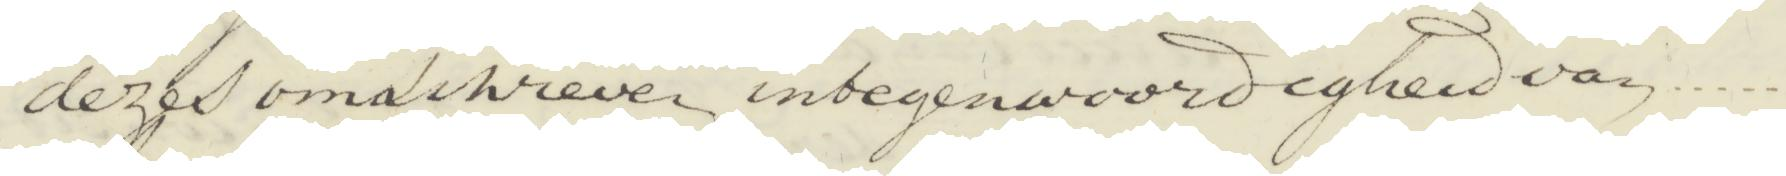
dezes omschreven integenwoordigheid van - - - - -
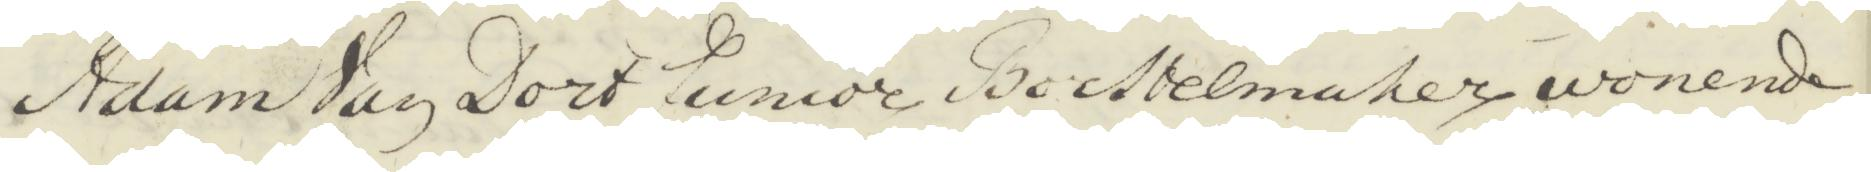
Adam Van Dort Junior Borstelmaker wonende
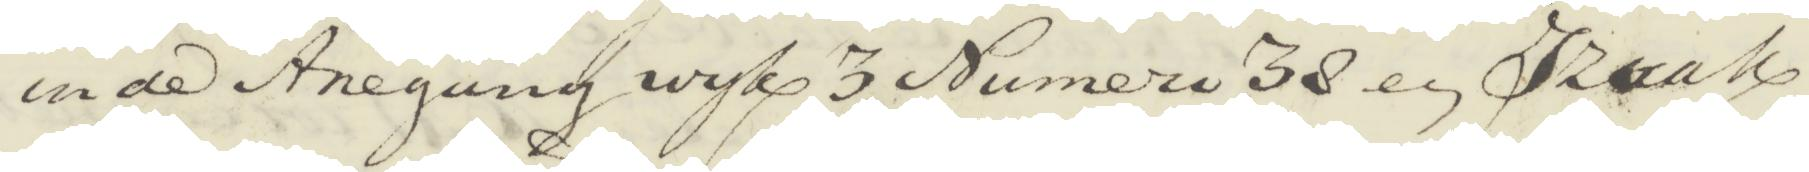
in de Anegang wyk 3 Numero 38 en Izaak
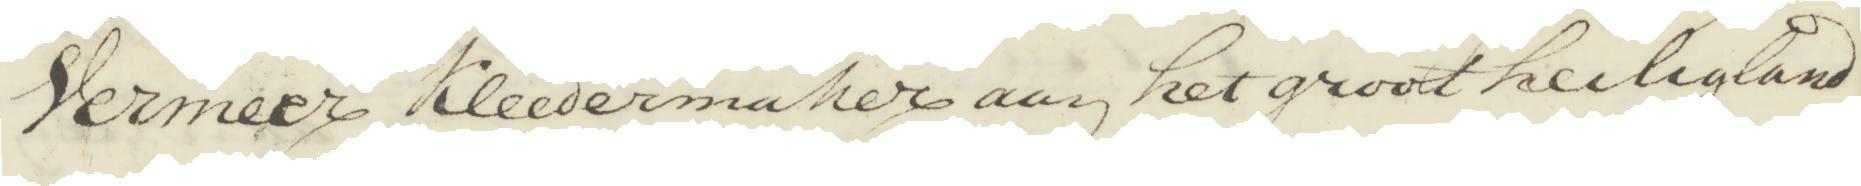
Vermeer Kleedermaker aan het groot heiligland
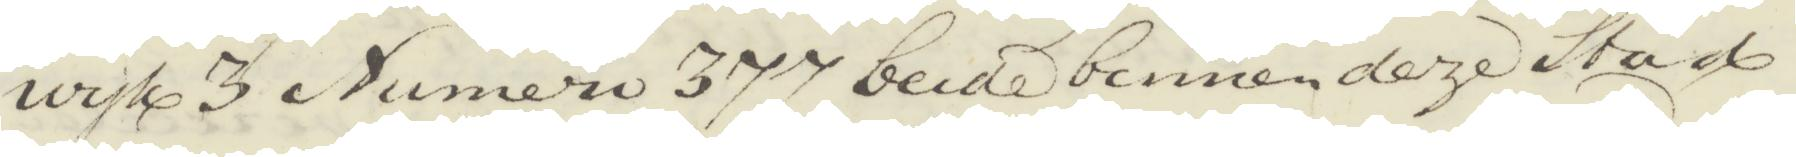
wyk 3 Numero 377 beide binnen deze Stad
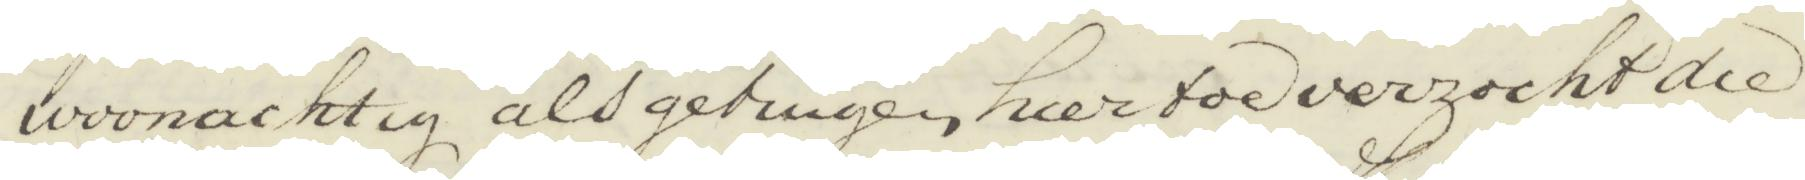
woonachtig als getuigen hier toe verzocht die
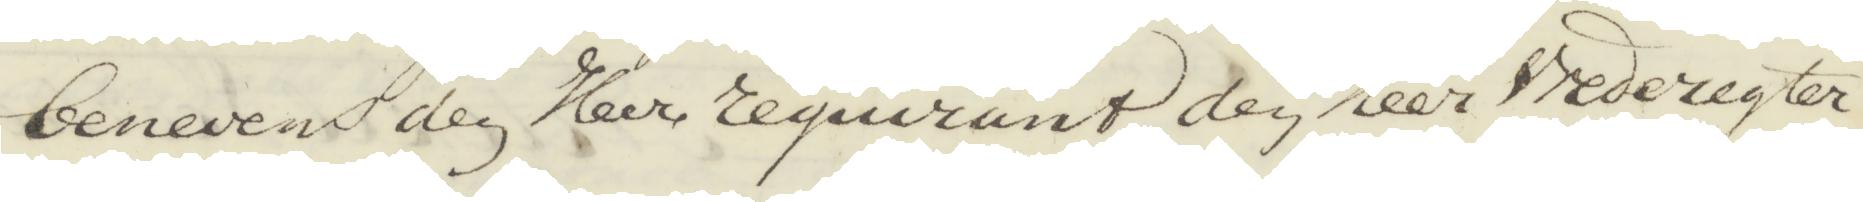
benevens den Heer requirant den Heer Vrederegter
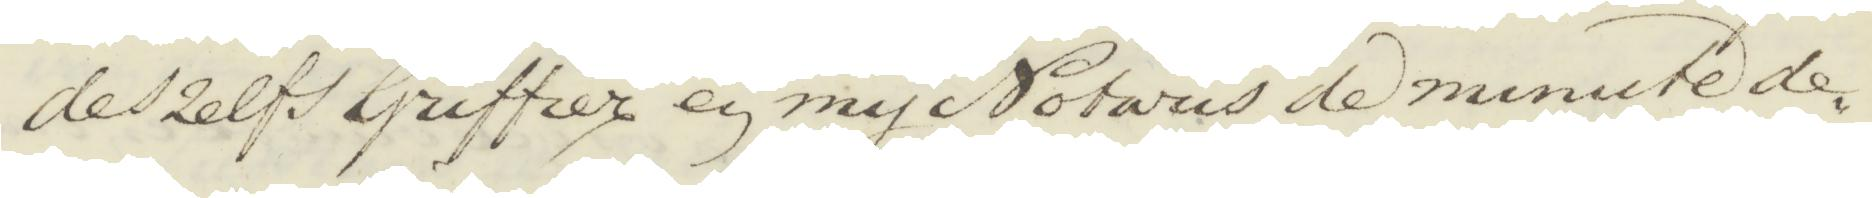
deszelfs Griffier en my Notaris de minute de„
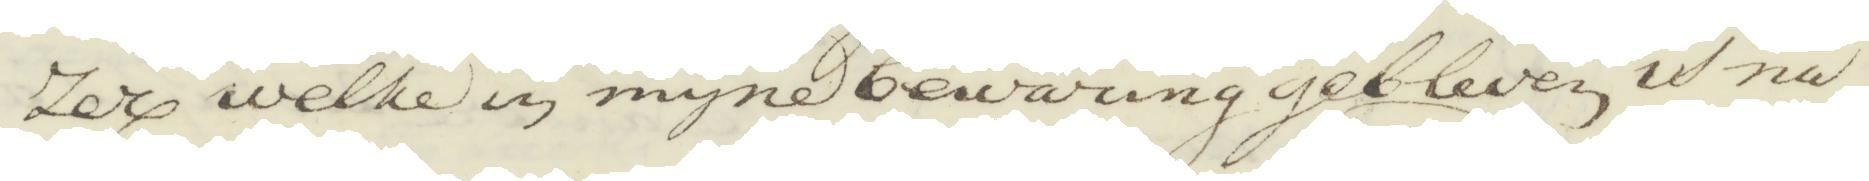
zer welke in myne bewaring gebleven is na
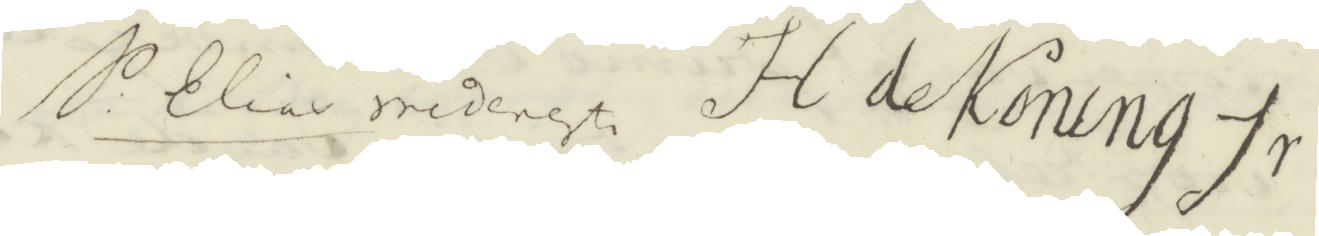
P: Elias vredergtr H de Koning Jr
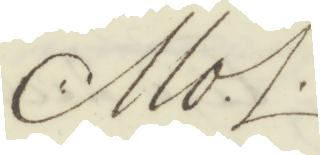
CMol.
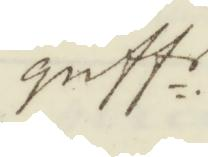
griff=r
